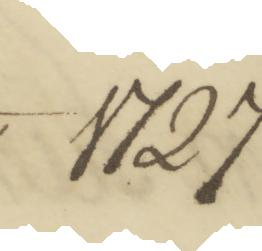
1727
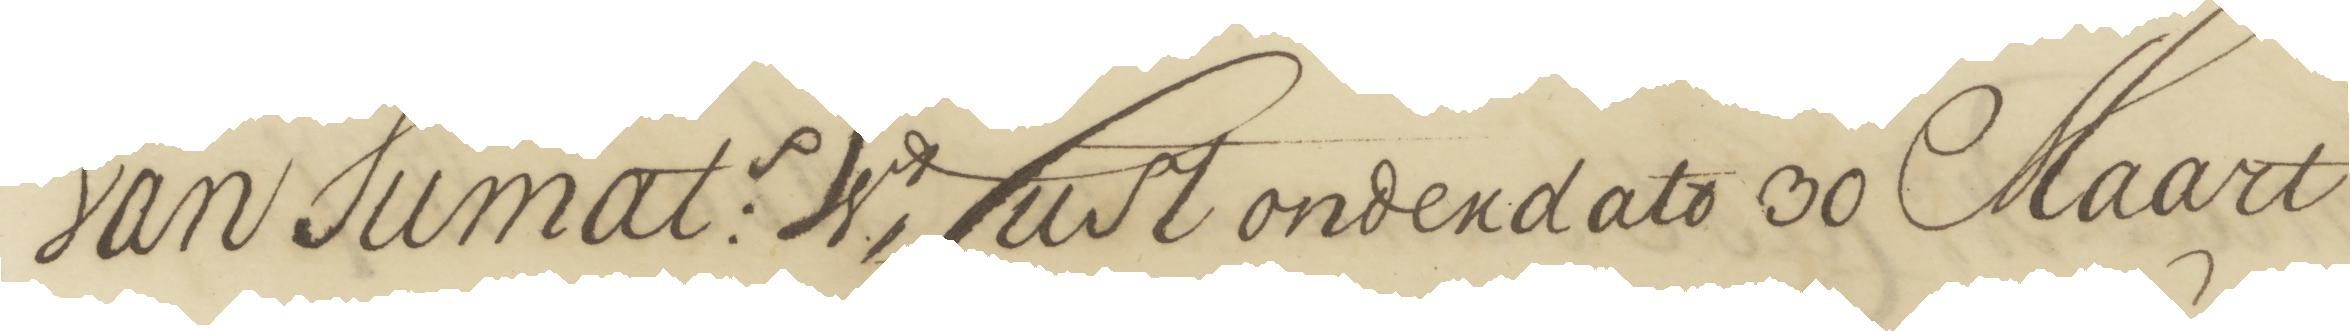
Van Sumat:s W„t Cust onderdato 30 Maart
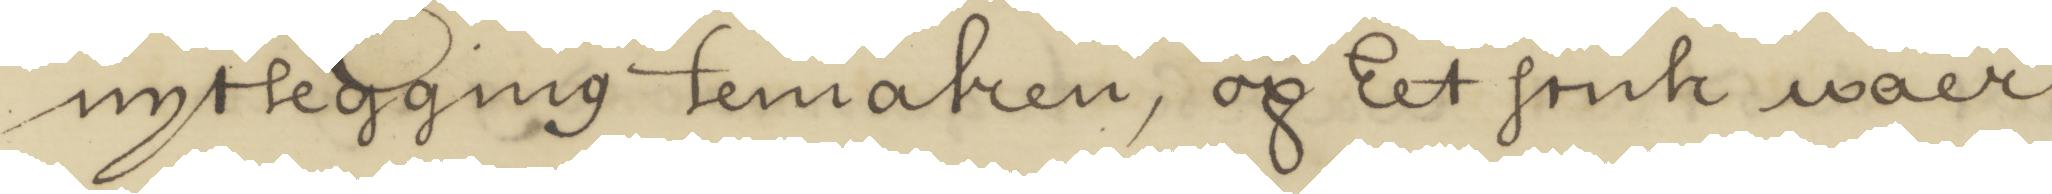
uytlegging temaken, op het stuk waer
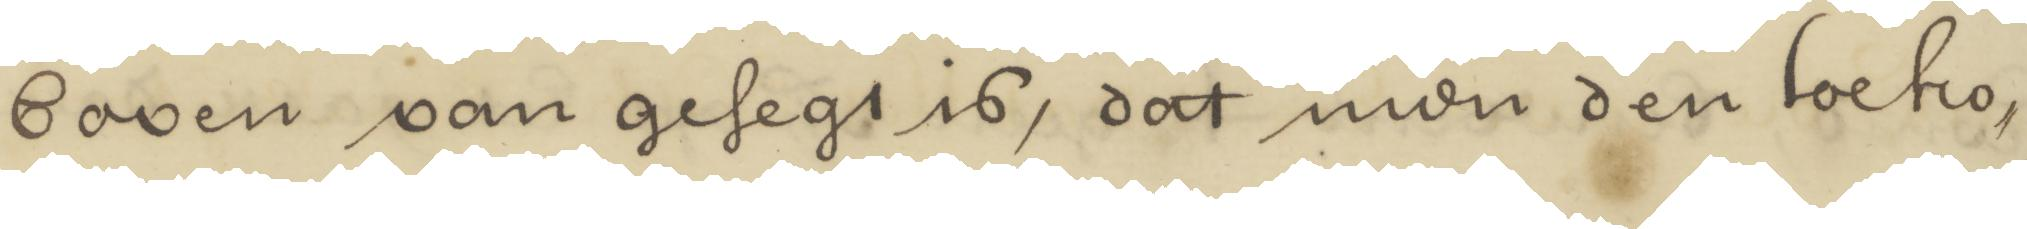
boven van gesegt is, dat men den toeko„
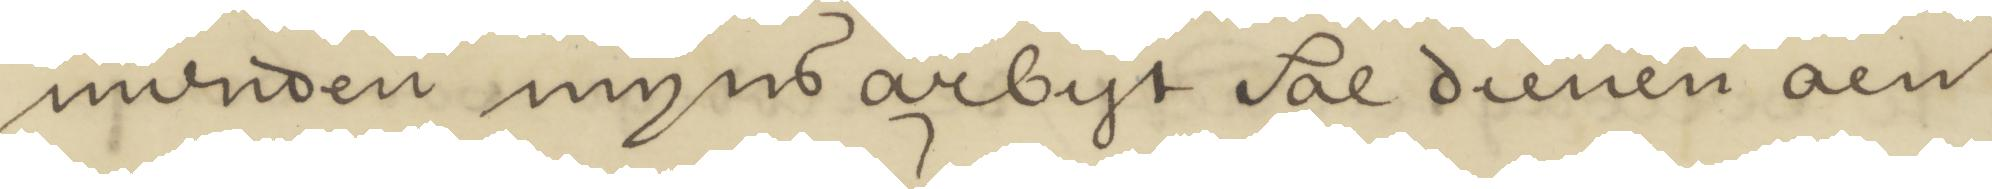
menden mijns arbijt sal dienen aen
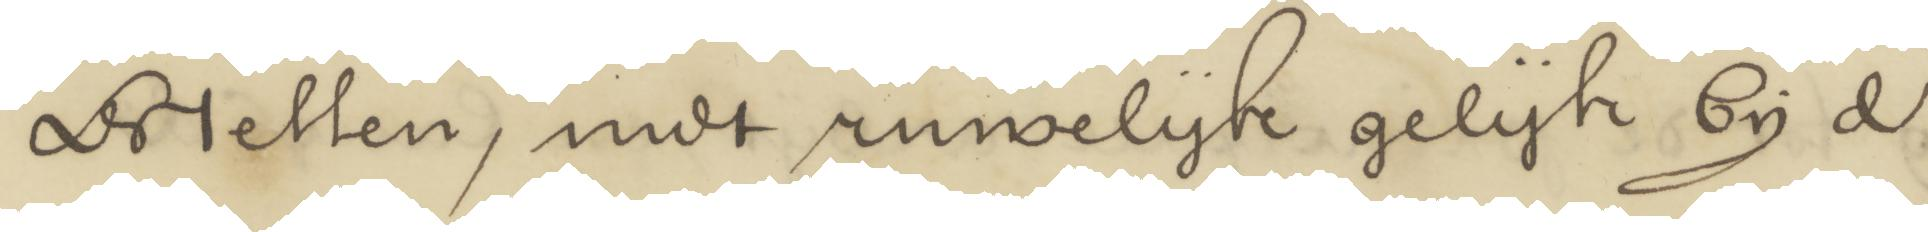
testellen, met ruwelijk gelijk bij de
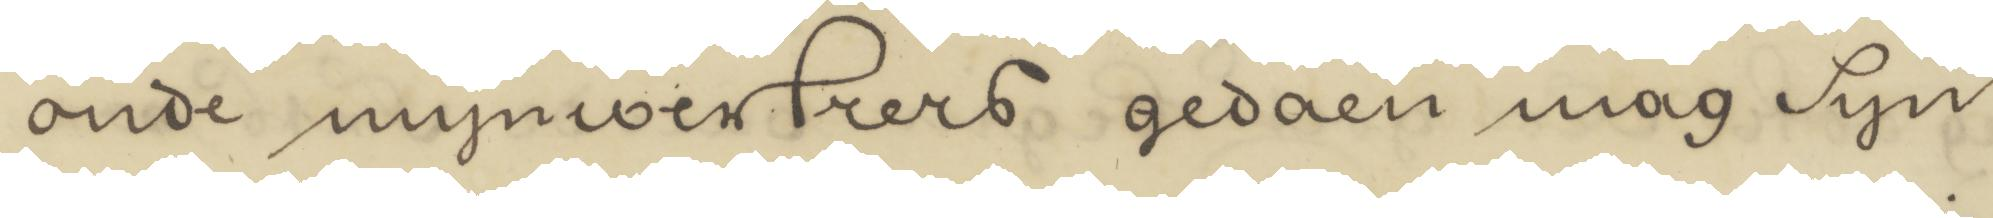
oude mijnwerkers gedaen mag syn
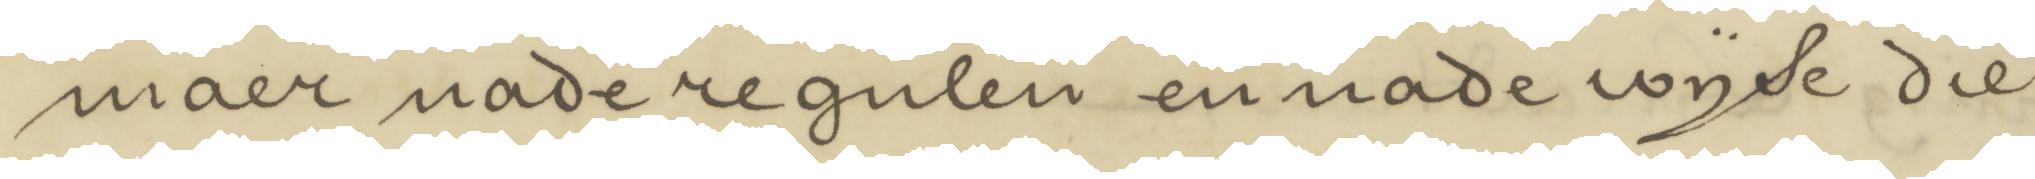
maer nade regulen en nade wijse die
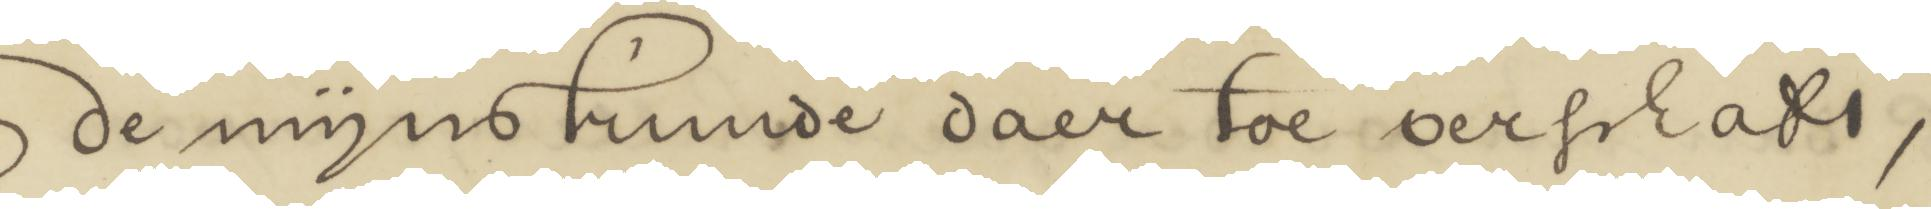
de mijns kunde daer toe verschaft,
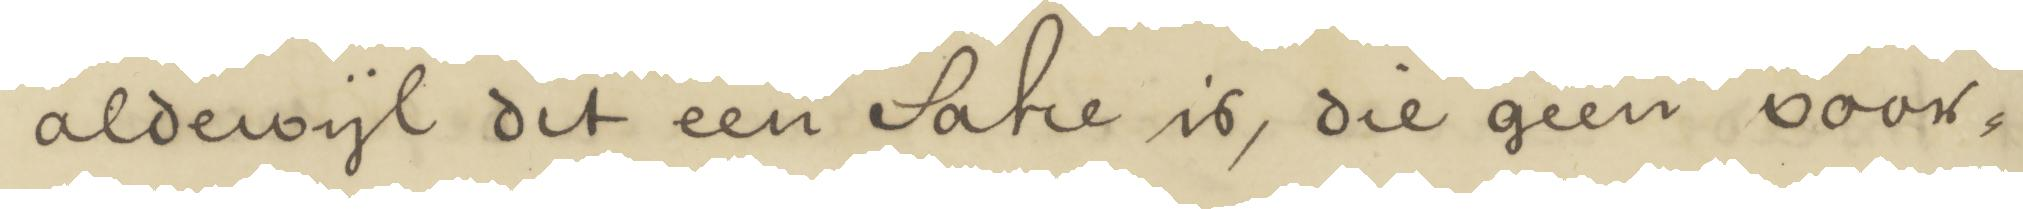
aldewijl dit een Sake is, die geen voor„
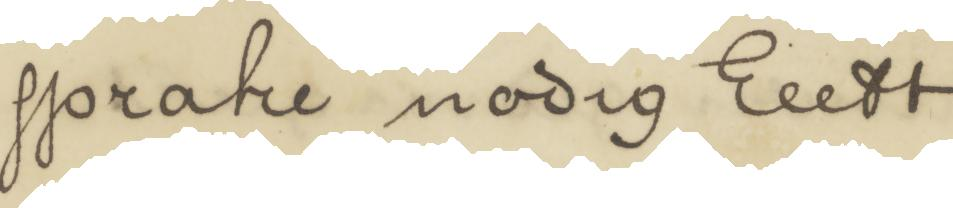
sprake nodig heeft
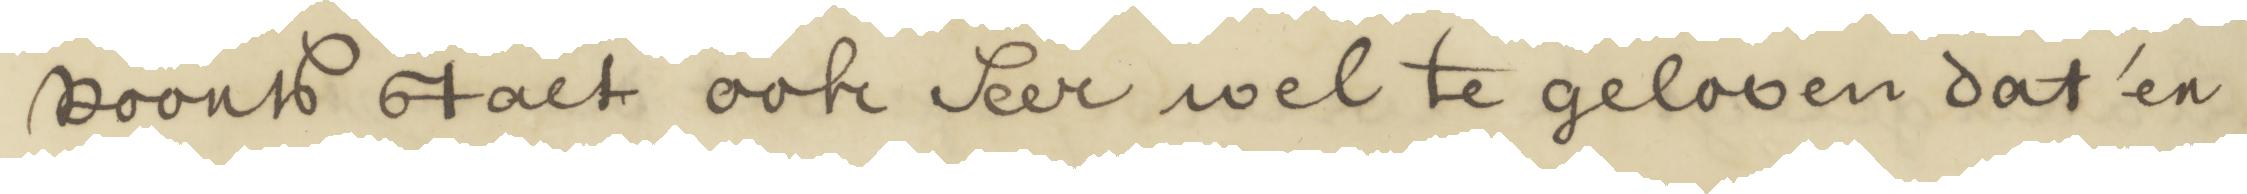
voorts staet ook seer wel te geloven dat 'er
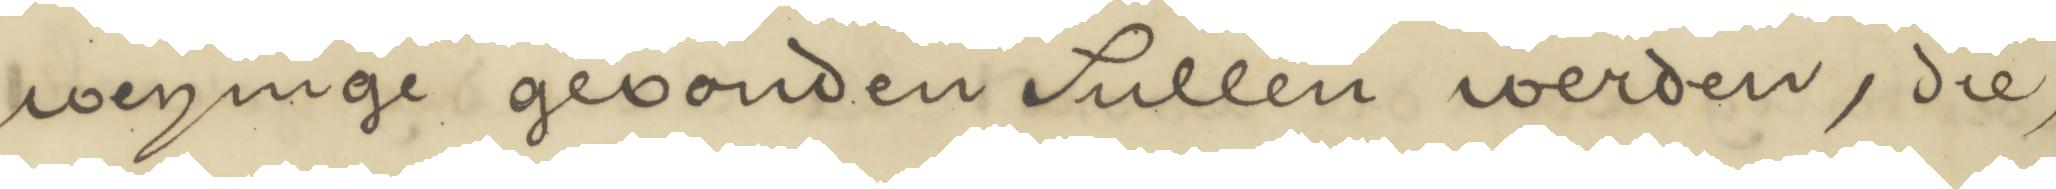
weynige gevonden Sullen werden, die,
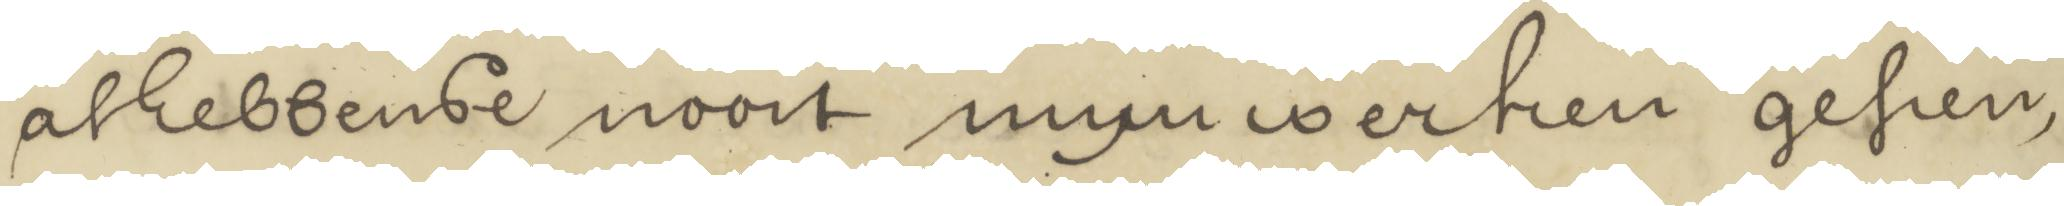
alhebbense nooit myn werken gesien,
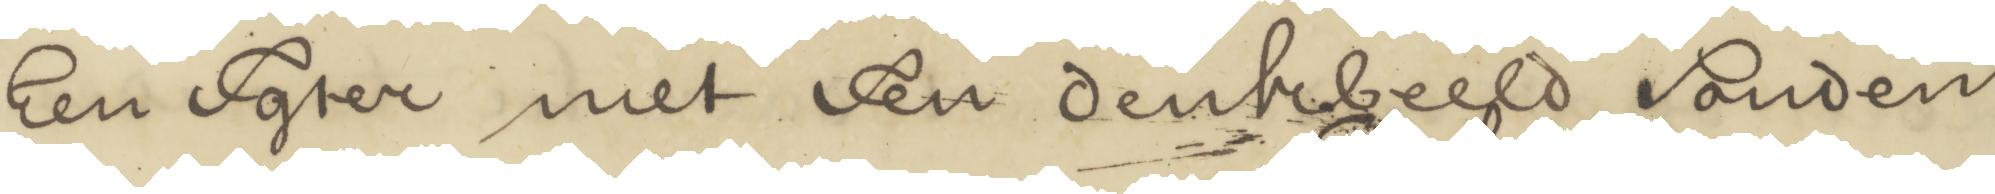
Een Egter met een denkbeeld Souden
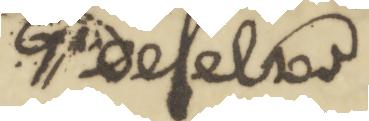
deselve
